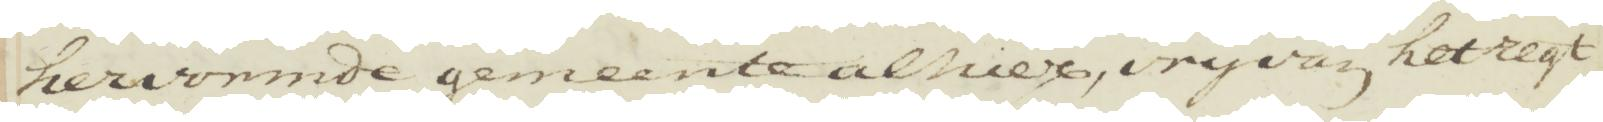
hervormde gemeente alhier, vrij van het regt
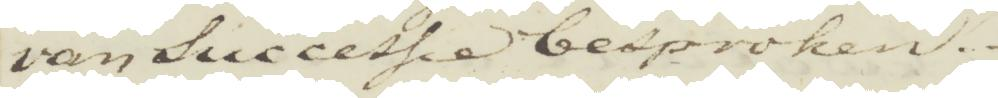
van successie besproken.
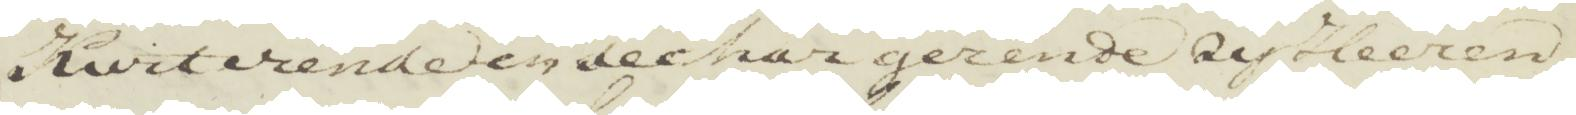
Kwiterende en dechargerende zy Heeren
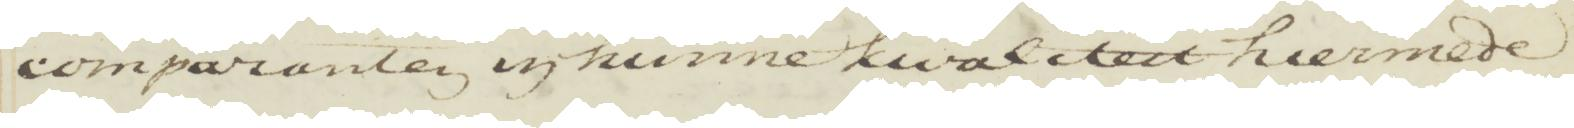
comparanten in hunne kwaliteit hiermede
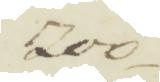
zoo
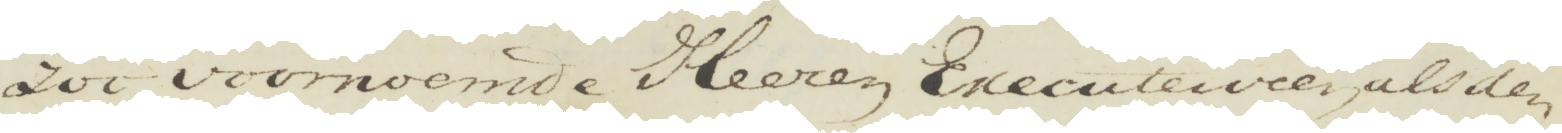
zoo voornoemde Heeren Executeuren, als den
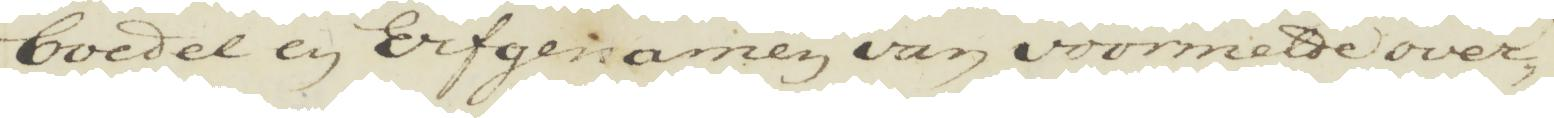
boedel en Erfgenamen van voormelde over„
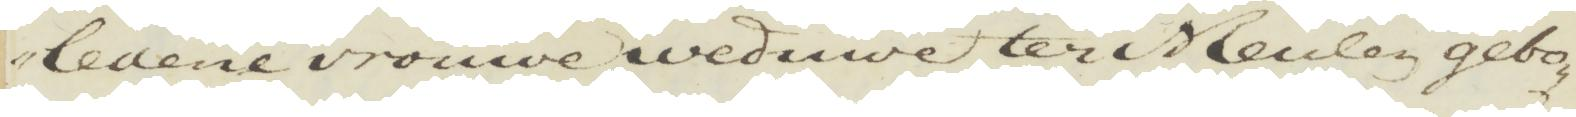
„ledene vrouwe weduwe ter Meulen gebo„
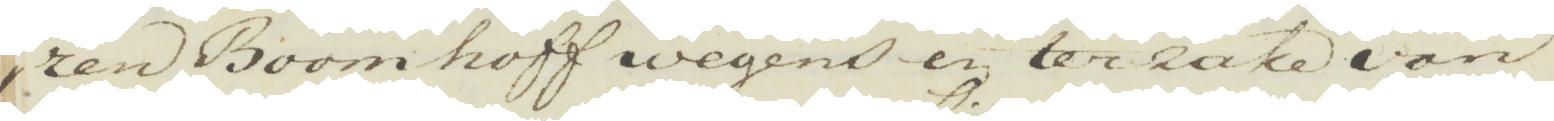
„ren Boomhoff wegens en ter zake van
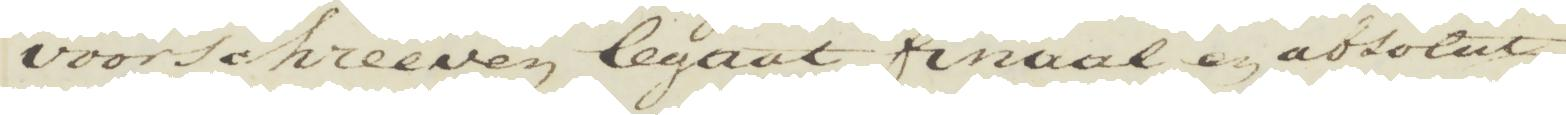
voorschreeven legaat finaal en absolut
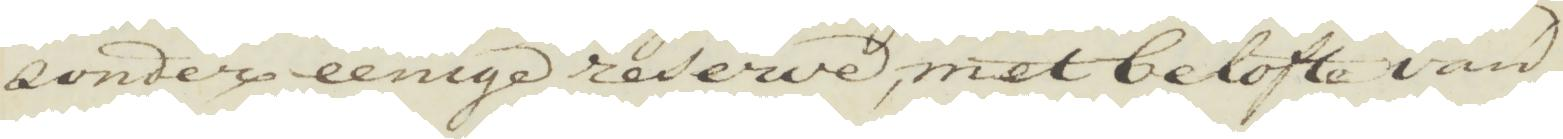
zonder eenige reserve, met belofte van
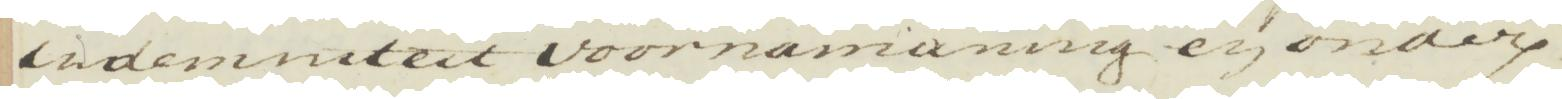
indemniteit voornamaning en onder
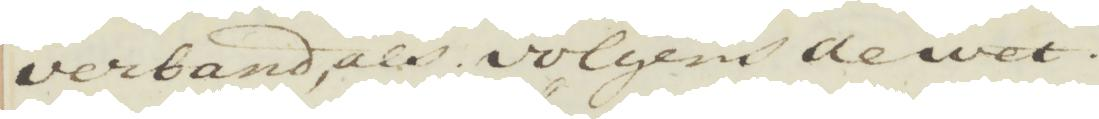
verband, als volgens de wet.
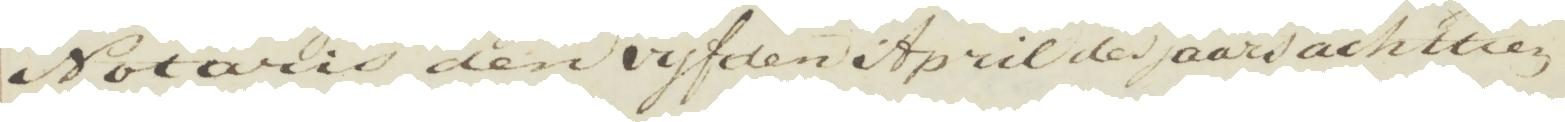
Notaris den vyfden April des jaars achttien
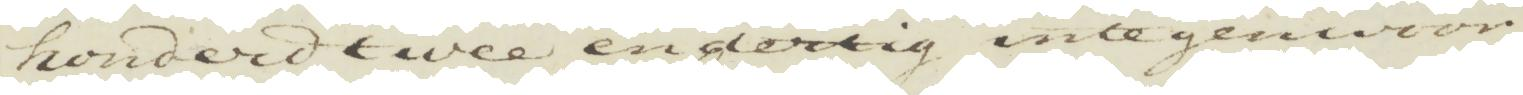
honderd twee en dertig in tegenwoor„
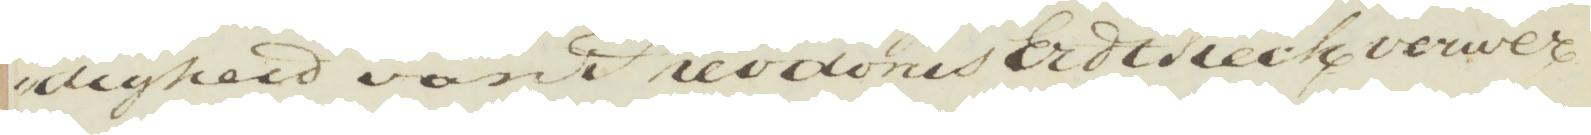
digheid van Theodorus Erdtsieck verwer
